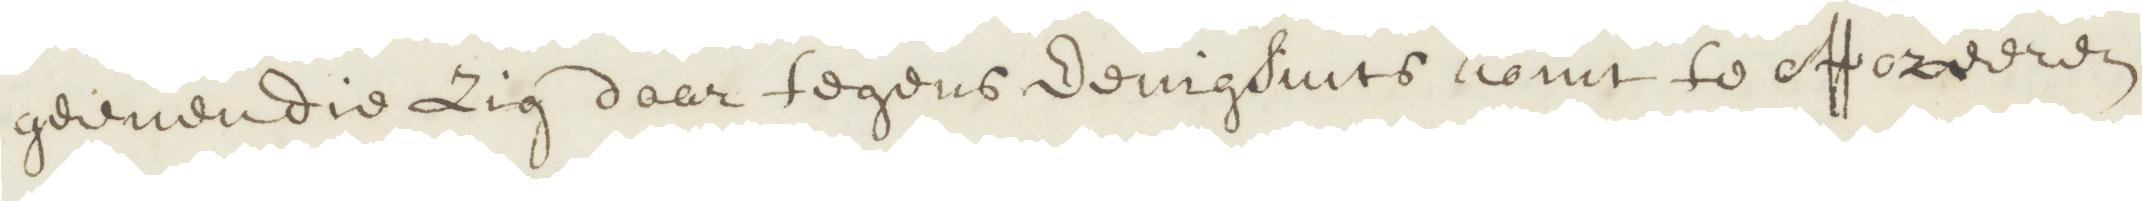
geenen die zig daar tegens Eenigsints komt te oppozeeren
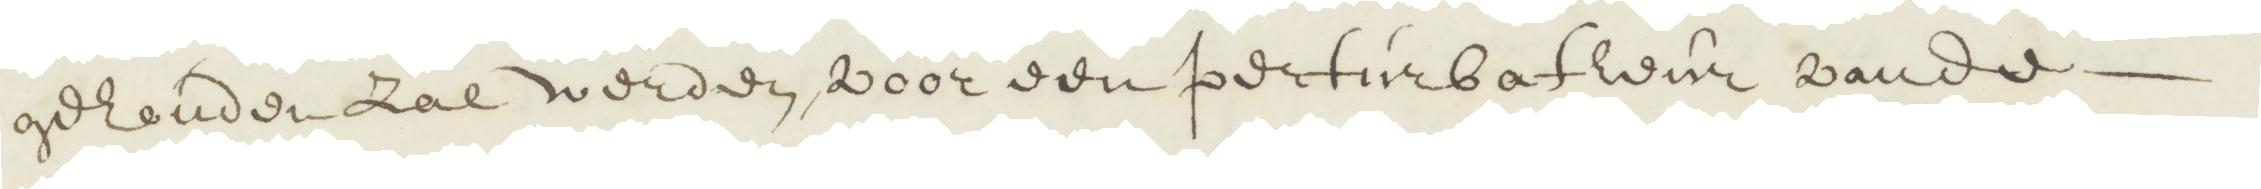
gehouden zal werden, voor een perturbatheur vande —
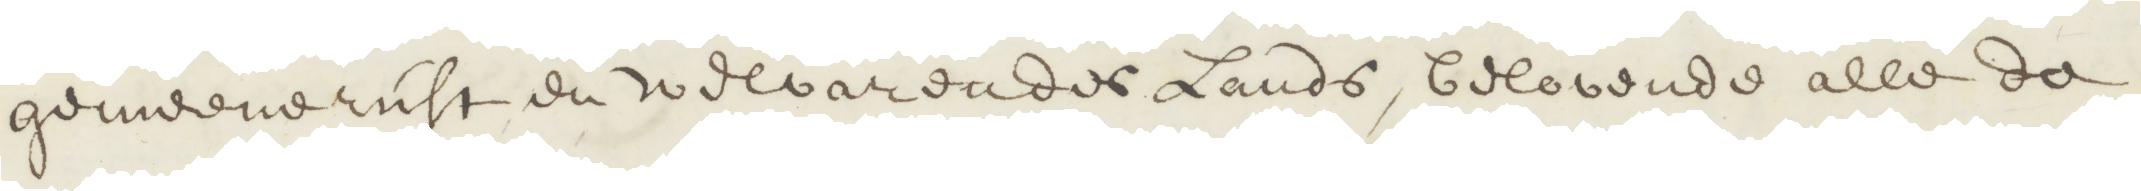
gemeene rust en welvaren des Lands, belovende alle de
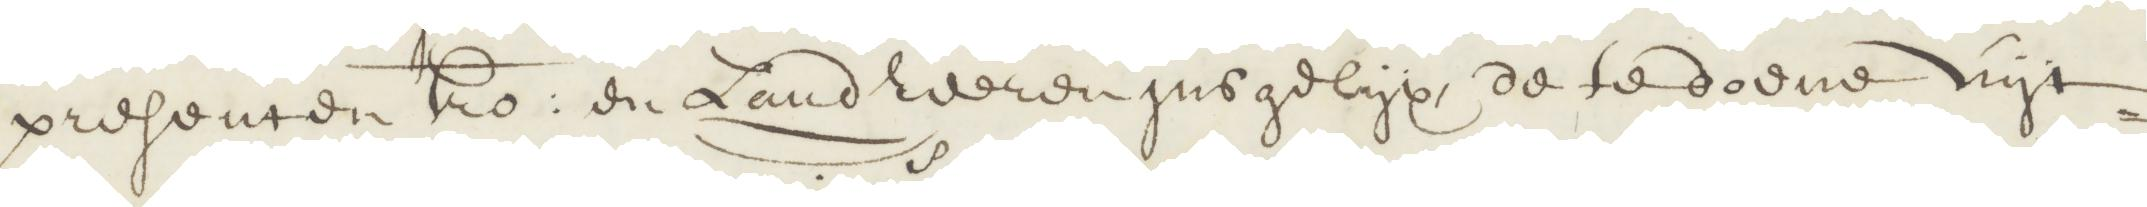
presenten ko: en Landheeren jnsgelijx, de te doene uijt =
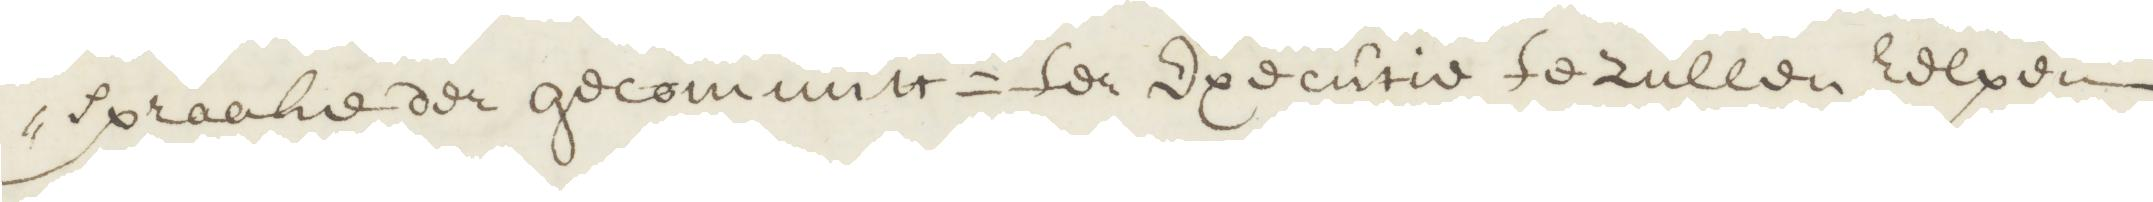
„spraake der gecommitt=s ter Executie te zullen helpen
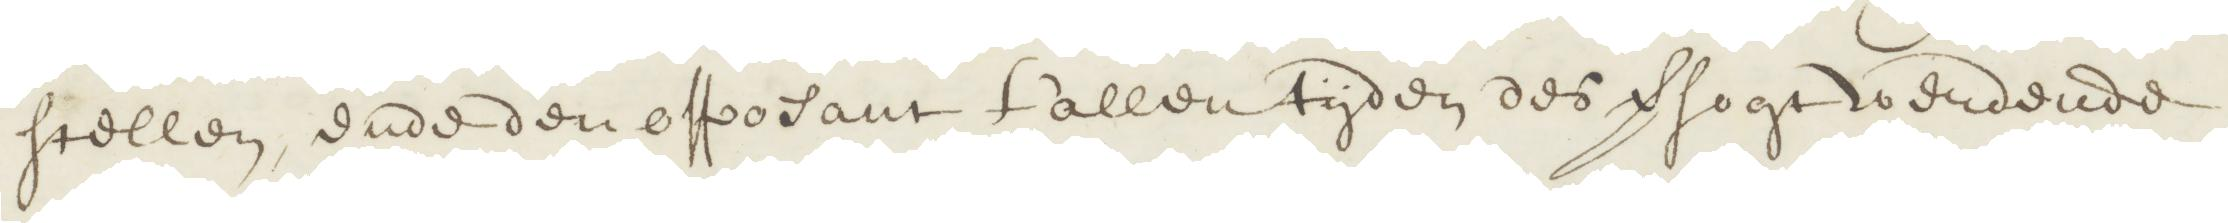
stellen, ende den opposant t'allen tijden des versogt werdende
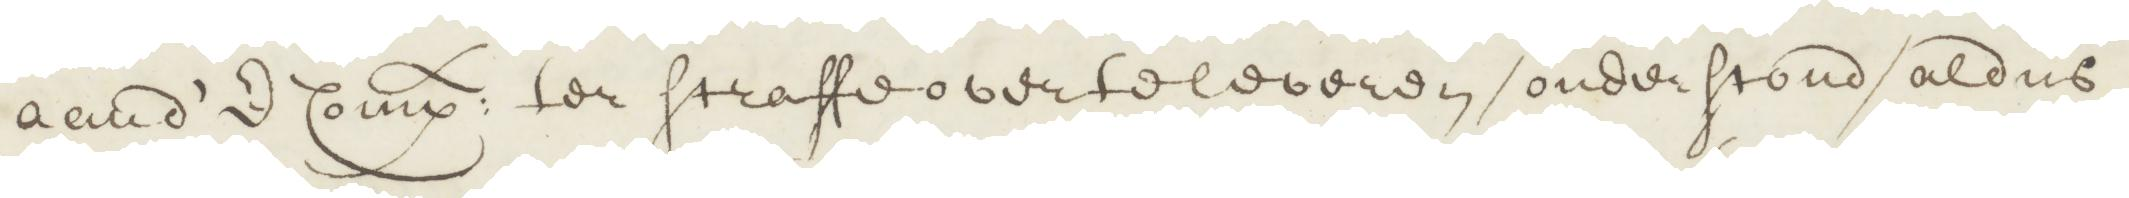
aan d’ E Comp: ter straffe overte leveren /onderstond/ aldus
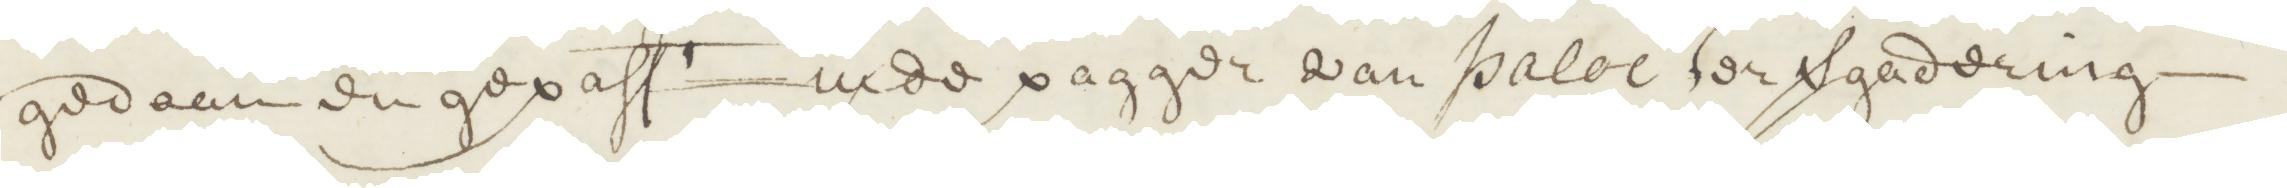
gedaan en gepass=t in de pagger van paloe ter vergadering —
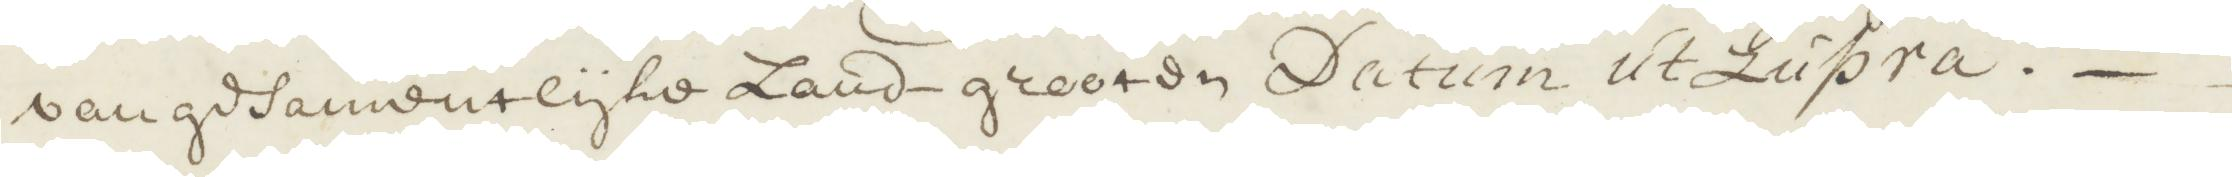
van gesamentlijke Land-grooten Datum ut zupra. —
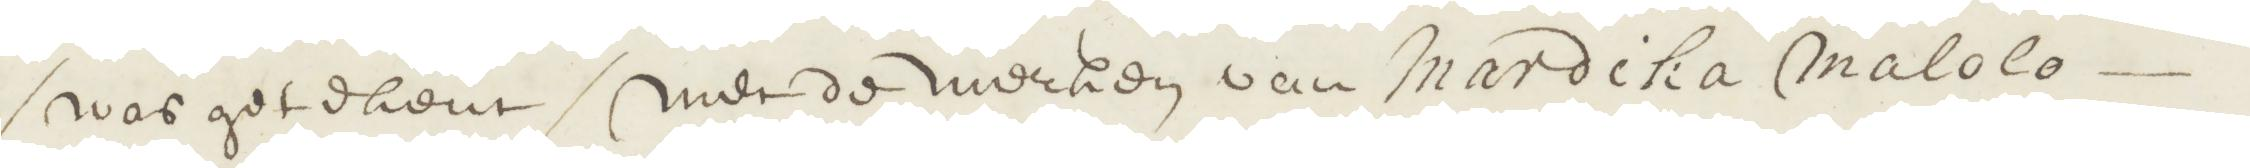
/was getekent/ met de merken van Mardika Malolo —
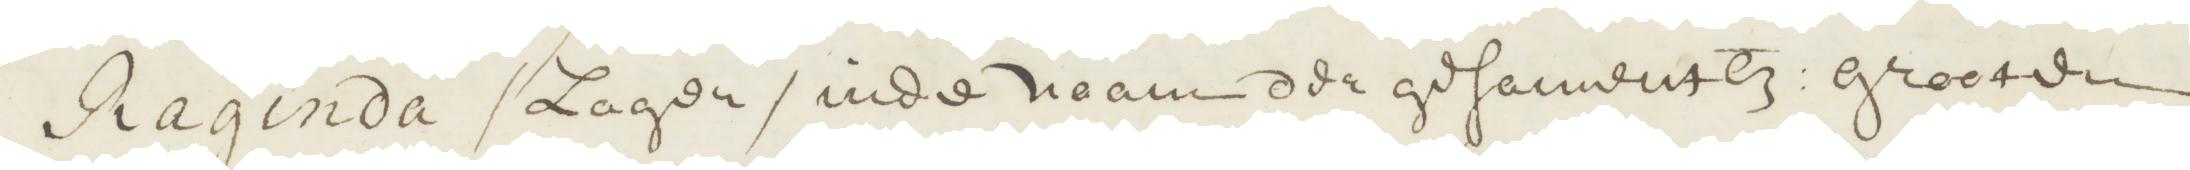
Raginda /Lager/ inde naam der gesamentlijk: grooten
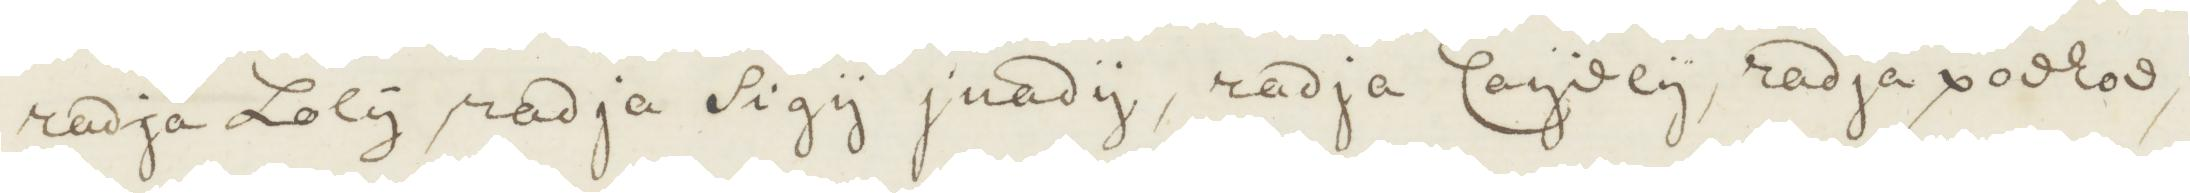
radja Lolij, radja sigij jnadij, radja Caijelij, radja poehoe,
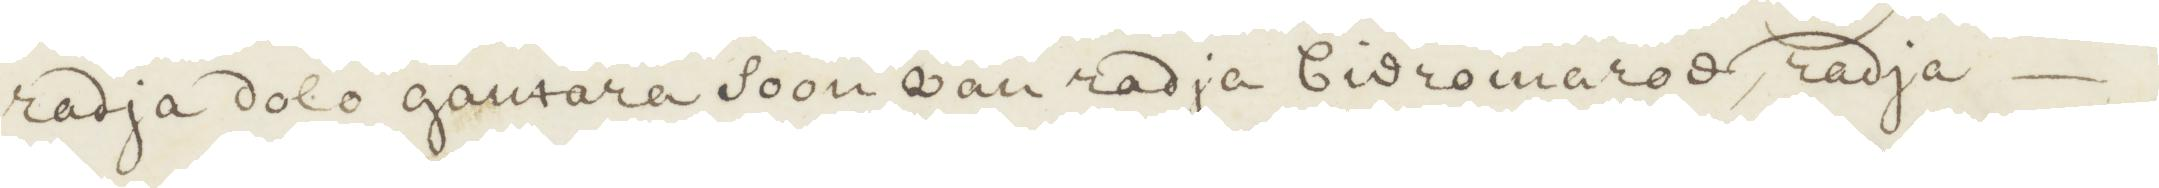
radja dolo gantara soon van radja bieromaroe, radja —
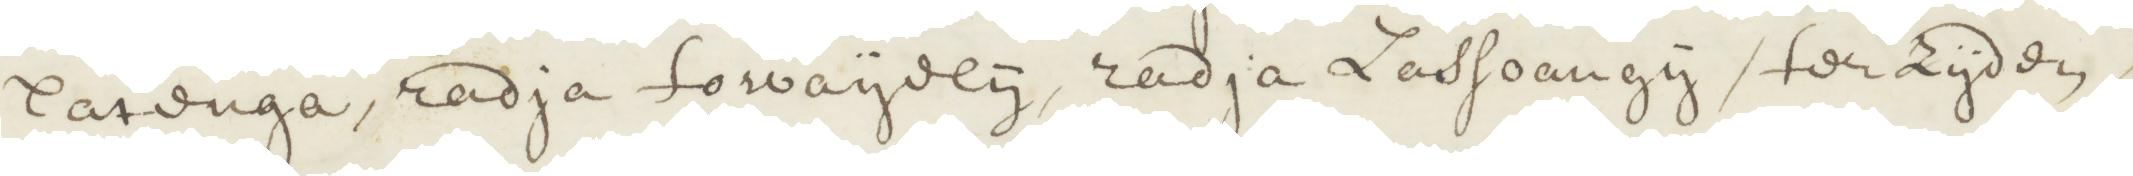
latenga, radja towaijelij radja Lassoangij /ter zijden/
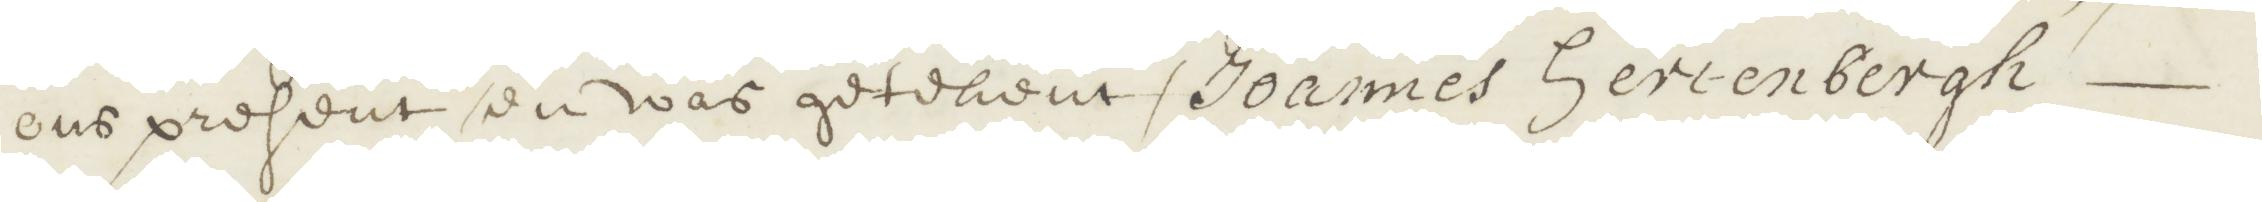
ons present /en was getekent / Ioannes Hertenbergh —
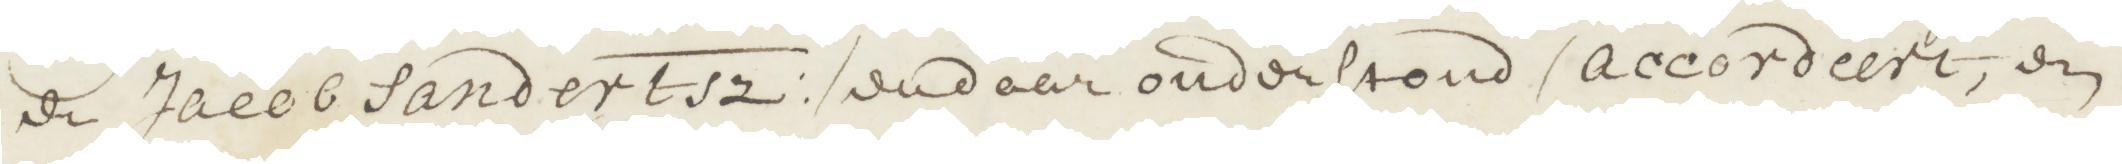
en Jacob sandertsz: /endaar onderstond /accordeert, en
